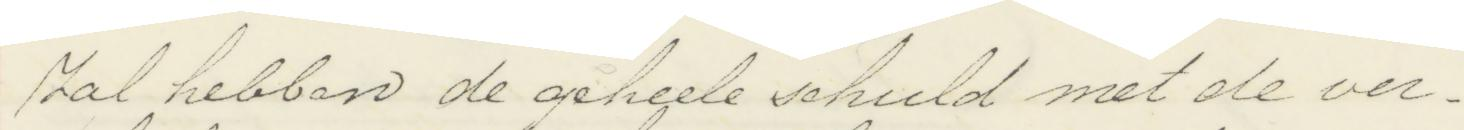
zal hebben de geheele schuld met de ver-
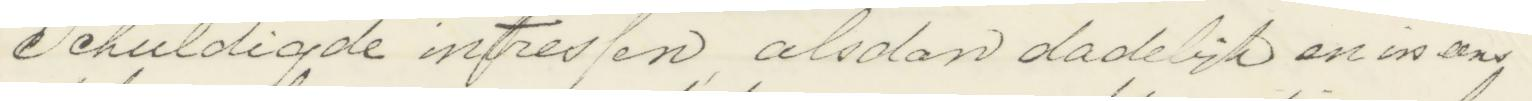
schuldigde intressen, als dan dadelijk en in eens
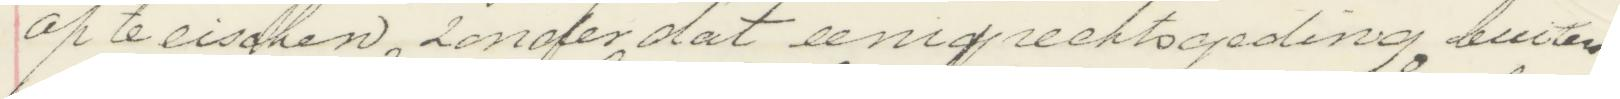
op te eischen, zonder dat eenig rechtsgeding, buiten
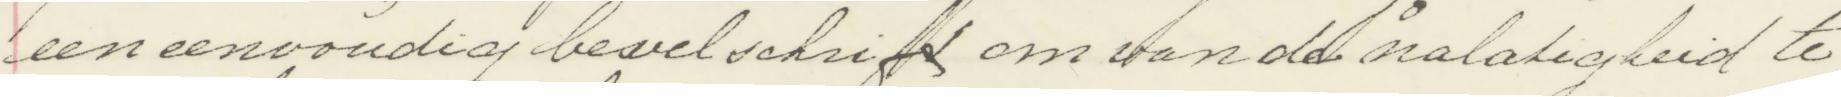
een eenvoudig bevelschrift om van de nalatigheid te
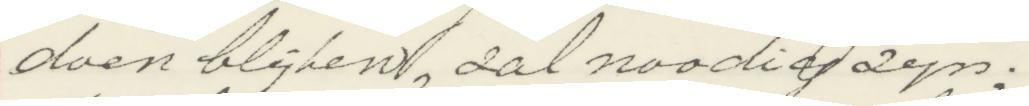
doen blijken, zal noodig zijn;
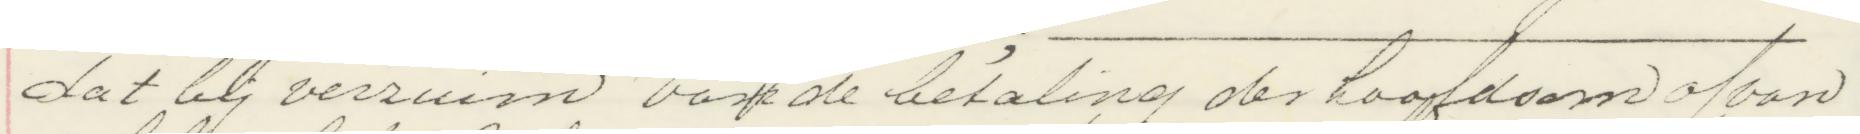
dat bij verzuim van de betaling der hoofdsom of van
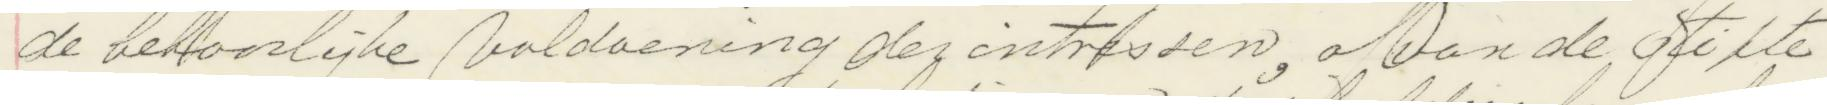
de behoorlijke voldoening der intressen, of van de stipte
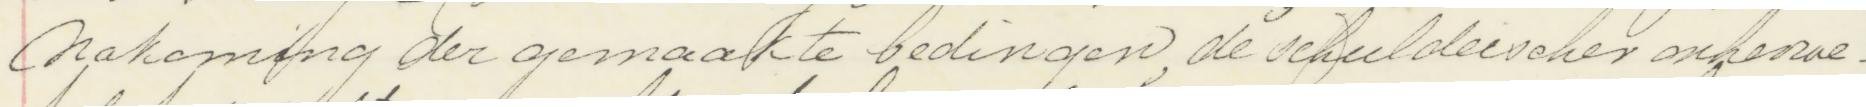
nakoming der gemaakte bedingen, de schuldeischer onherroe
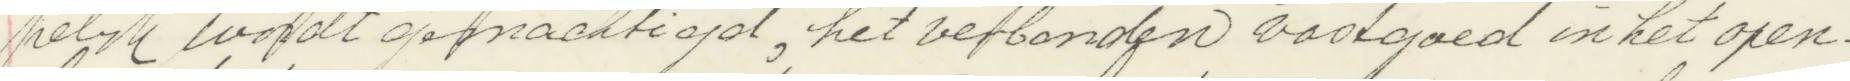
pelyk wodt gemachtigd, het verbonden vastgoed in het open
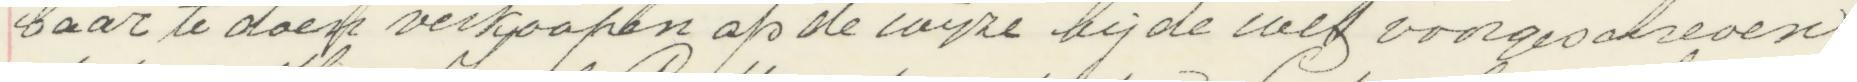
baar te doen verkoopen op de wijze bij de wet voorgeschreven;
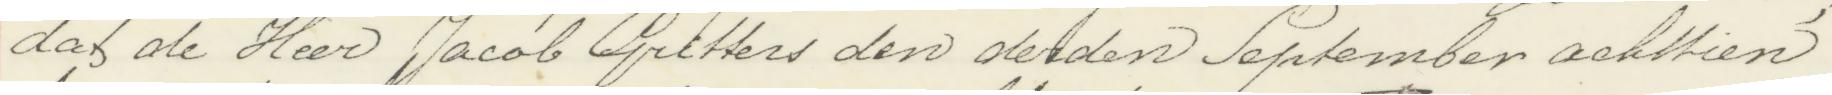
dat de Heer Jacob Gritters den derden September achttien
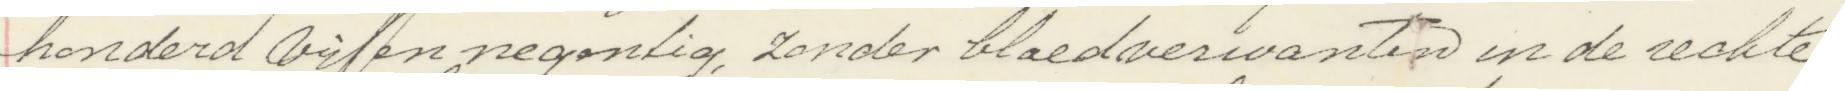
honderd vijf en negentig, zonder bloedverwanten in de rechte
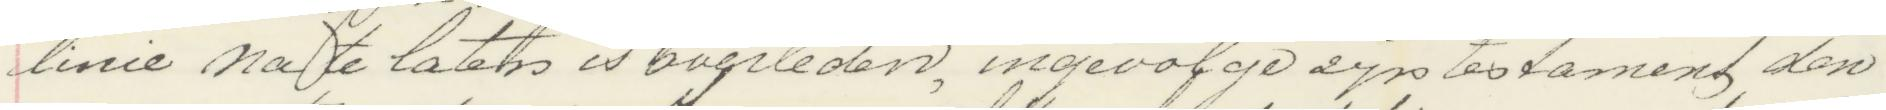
linie na te laten is overleden, ingevolge zijn testament den
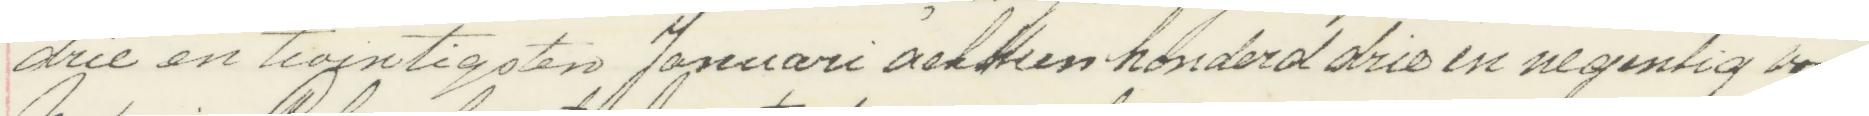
drie en twintigsten Januari achttien honderd drie en negentig voor
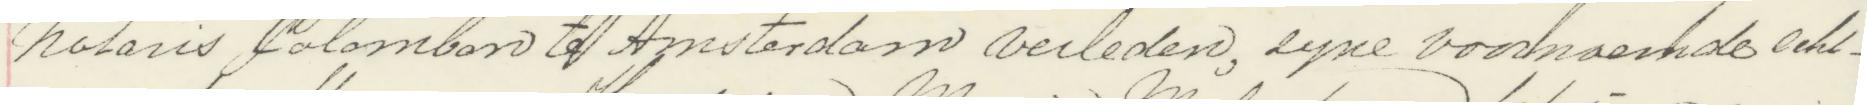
Notaris, Colombon te Amsterdam verleden, zyne voornoemde echt-
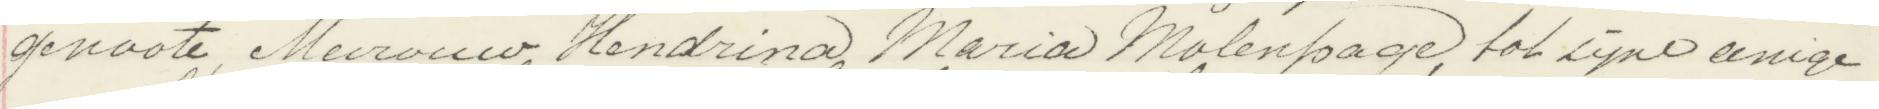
genoote, Mevrouw Hendrina Maria Molenpage, tot zijne eenige
